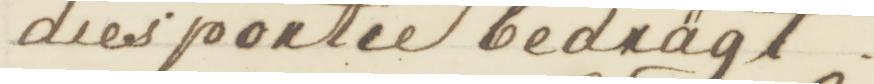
dies portie bedrägt .
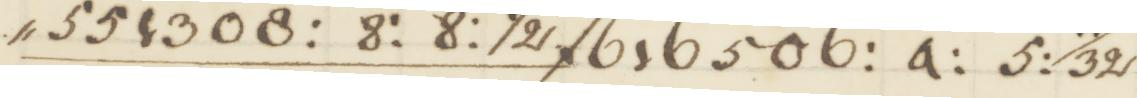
„ 551308: 8: 8: ½ ƒ 616506: 4: 5: 11/32
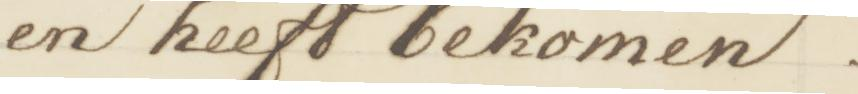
en heeft bekomen
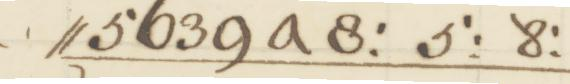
. „563948: 5: 8:
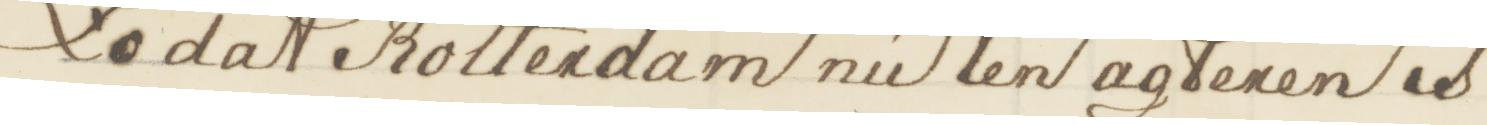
Zo dat Rotterdam nu ten agteren is
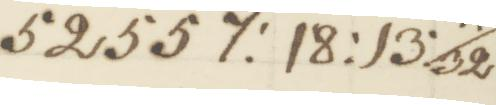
52557: 18: 13: 11/32
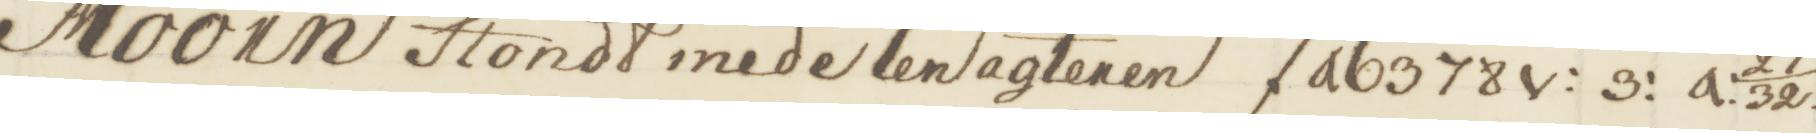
Hoorn stondt mede ten agteren ƒ463781: 3: 4:27/32
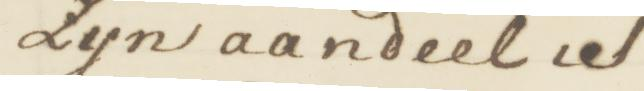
zyn aandeel is
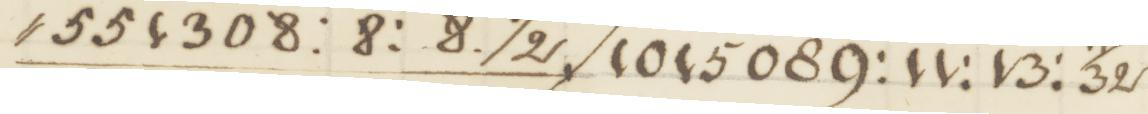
„ 551308: 8: 8.½ ƒ 1015089: 11: 13: 11/32
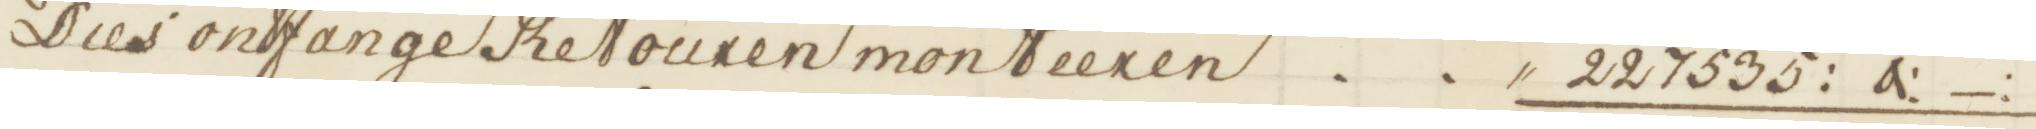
Dies ontfange Retouren monteeren . . „ 227535: 4: – : –
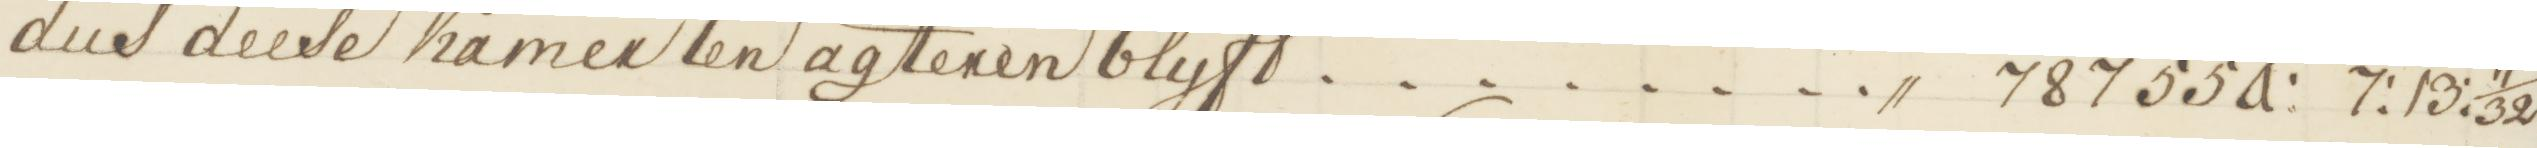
dus deese Kamer ten agteren blyft . . . . . . . . „ 787554: 7: 13: 11/32.
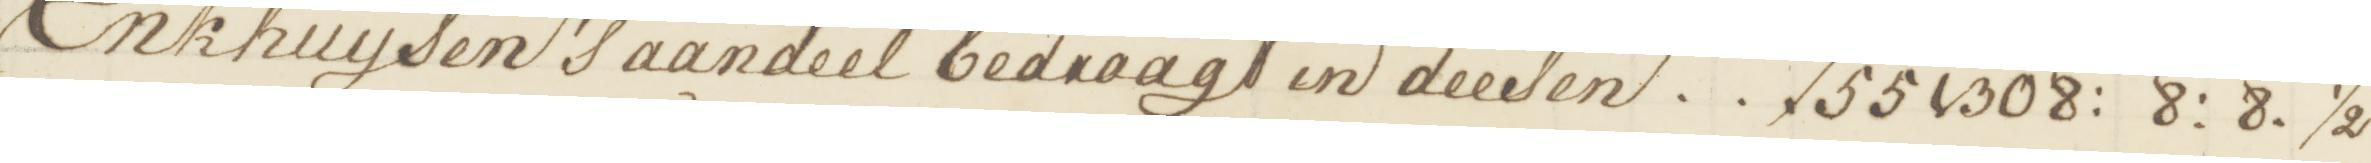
Enkhuysen 's aandeel bedraagt in deesen . . ƒ551308: 8: 8. ½
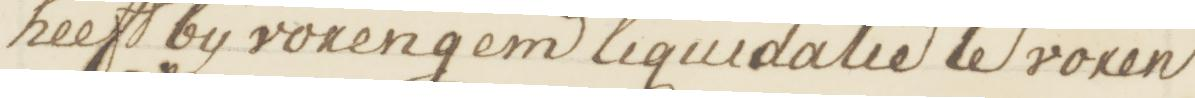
heeft by vorengem liquidatie te voren
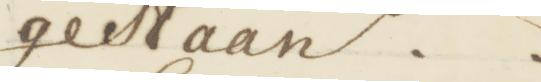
gestaan . .
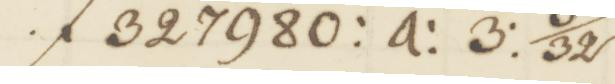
. ƒ 327980: 4: 3: 5/32
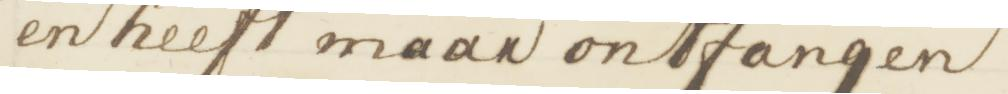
en heeft maar ontfangen
